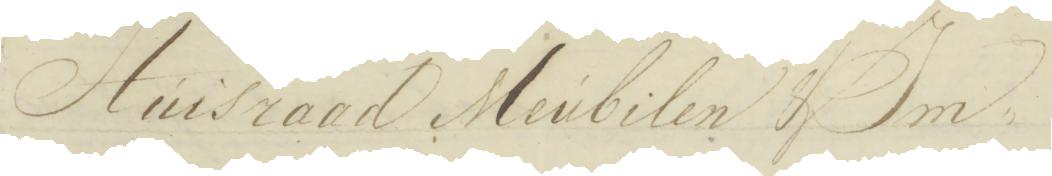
Huisraad Meubilen & Jm„
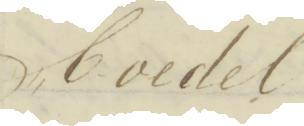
„boedel
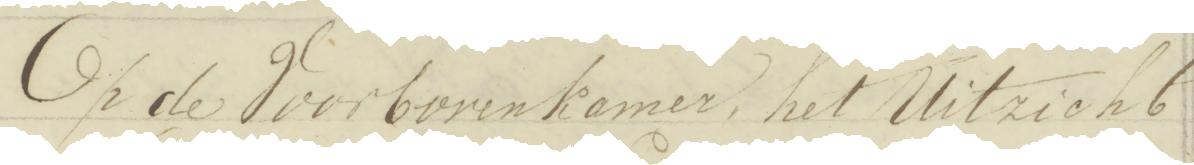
Op de Voorbovenkamer, het Uitzicht
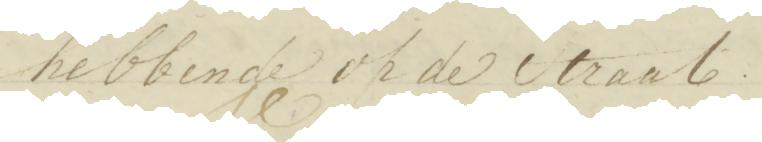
hebbende op de Straat.
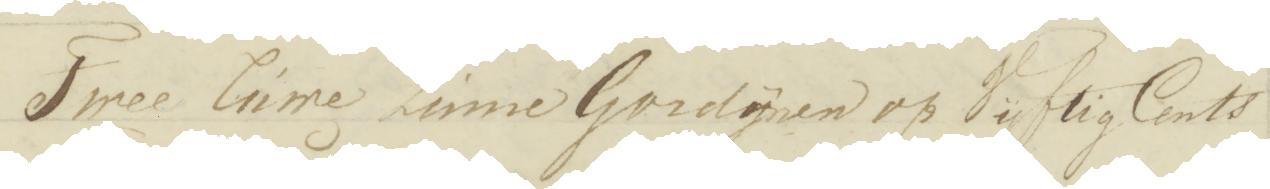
Twee ruwe Linne Gordijnen op Vijftig Cents ƒ 50
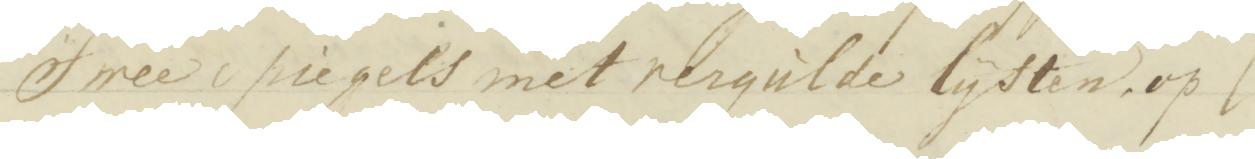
Twee Spiegels met vergulde lijsten, op
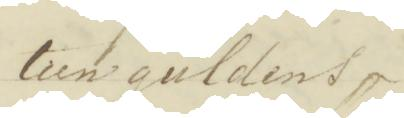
tien guldens . . . . . . . . . . . „ 10 „ —
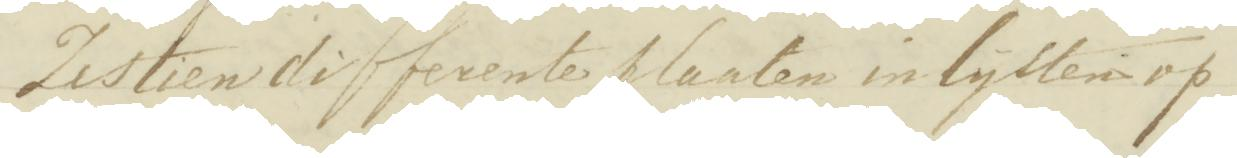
Zestien differente plaaten in lijsten op
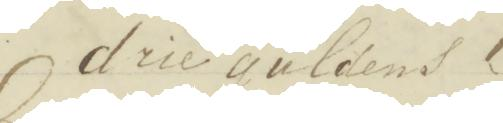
drie guldens . . . . . . . . . „ 3 „ —
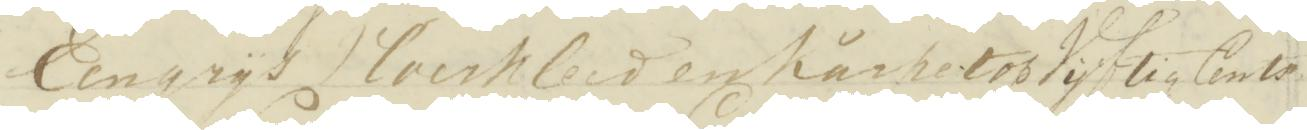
Een grijs Vloerkleed en Karpet tot Vijftig Cents „ — „ —
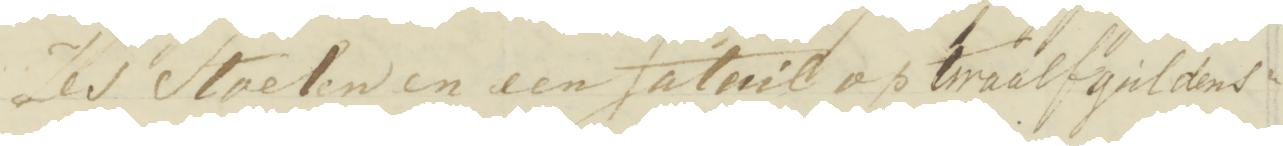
Zes stoelen en een Fatuil op twaalf guldens „ 12 „ —
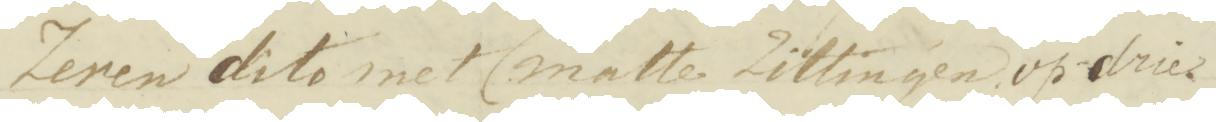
Zeven dito met matte zittingen, op drie
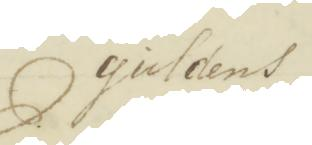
guldens . . . . . . . . . . . . „ 3 „ —
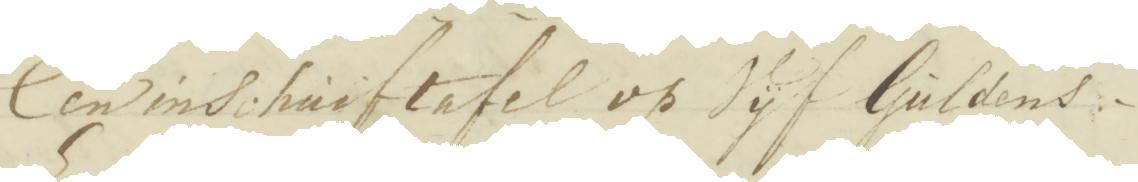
Een inschuiftafel op Vijf Guldens: „ 5 „ —
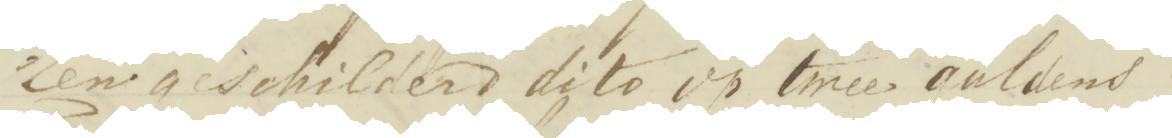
Een geschilderd dito op twee guldens . „ 2 „ —
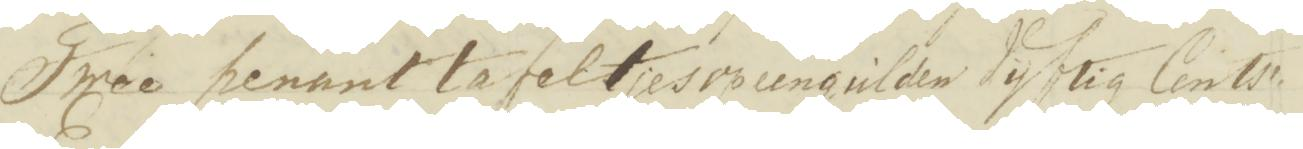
Twee penant tafeltjes op een gulden Vijftig Cents „ 1 „ 50
